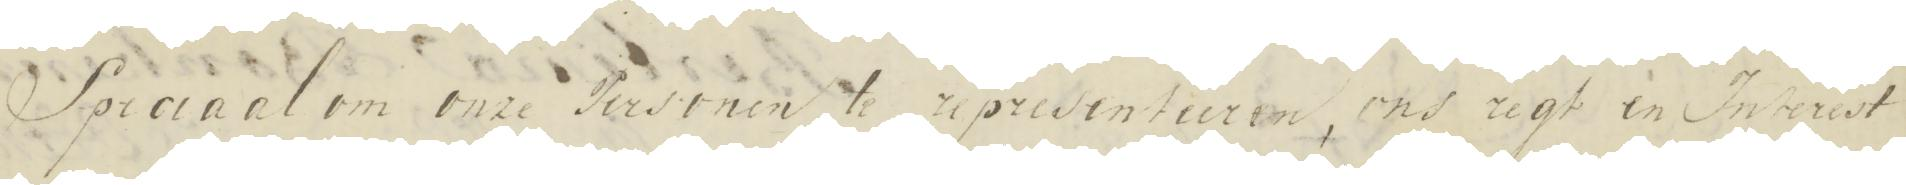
Speciaal om onze Personen te representeeren, ons regt en Interest
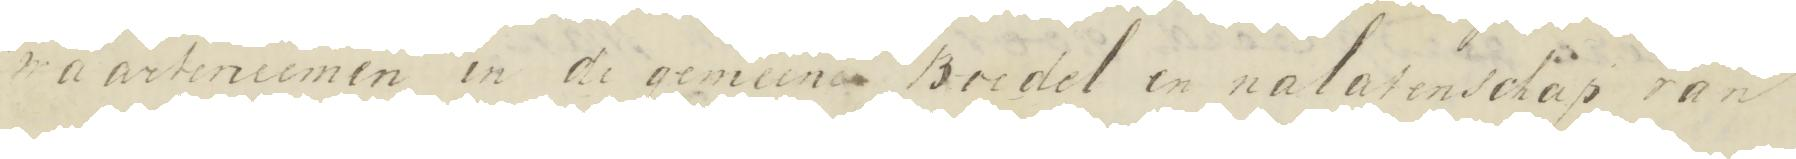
waarteneemen in de gemeen Boedel en nalatenschap van
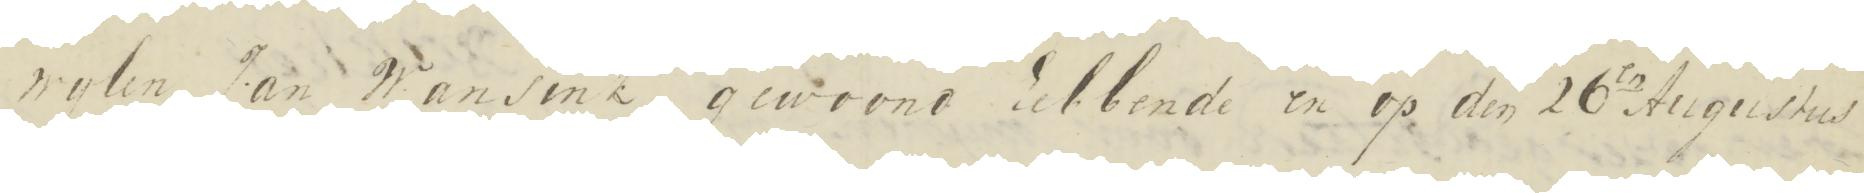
wylen Jan Wansink, gewoond hebbende en op den 26-en Augustus
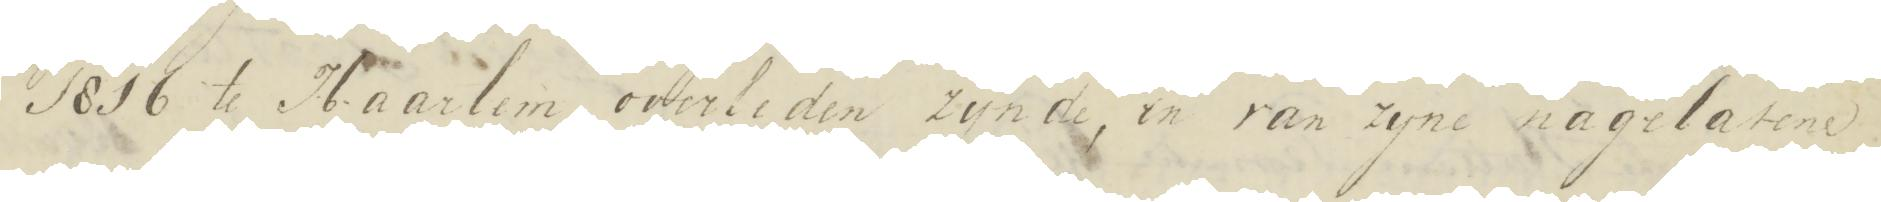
1816 te Haarlem overleden zynde, in van zijne nagelatene
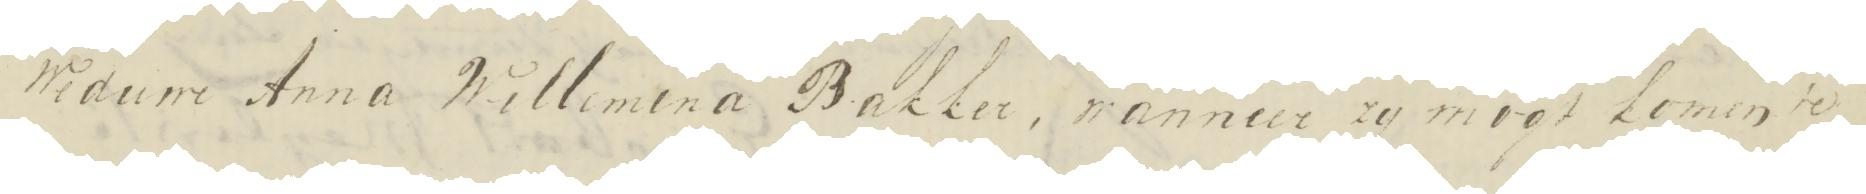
weduwe Anna Willemina Bakker, wanneer zy mogt lomen te
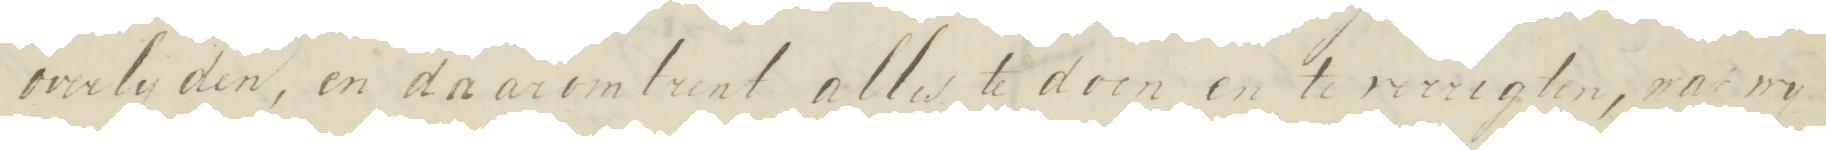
overlijden, en daar omtrent alles te doen en te verrigten, wat wy
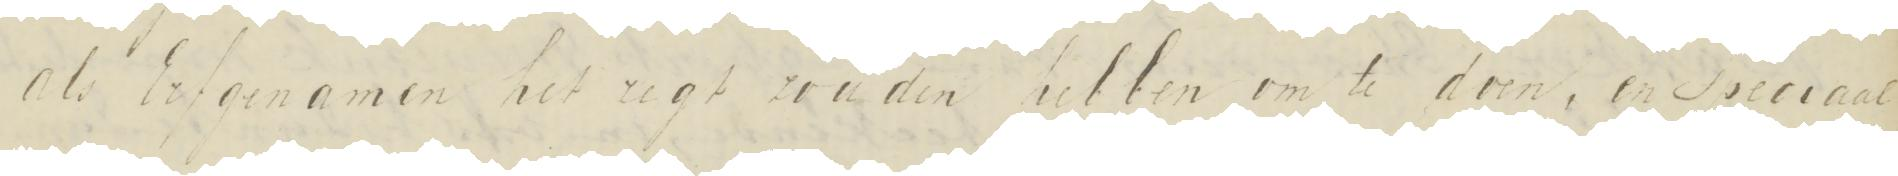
als Erfgenamen het regt zouden hebben om te doen, en speciaal
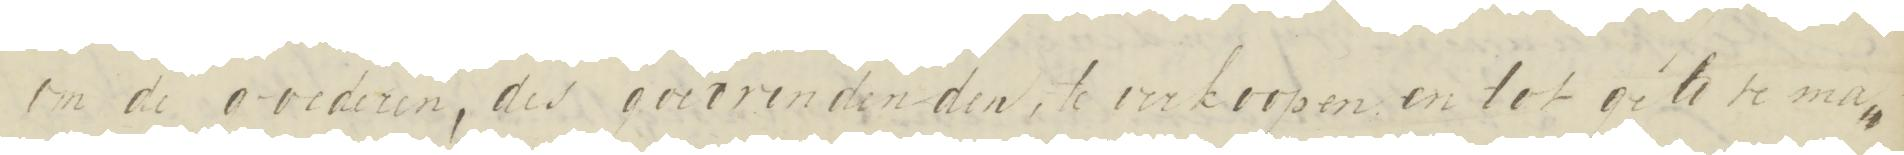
om de goederen, des goedren den den, te verkoopen en tot gild te ma„
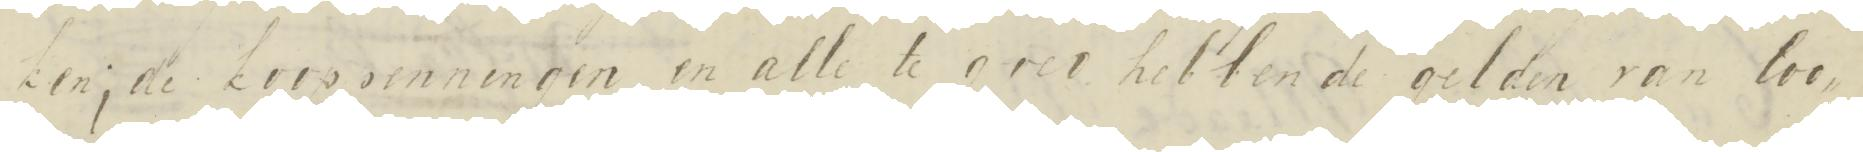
ken; de kooppenningen en alle te goed hebbende gelden van loo„
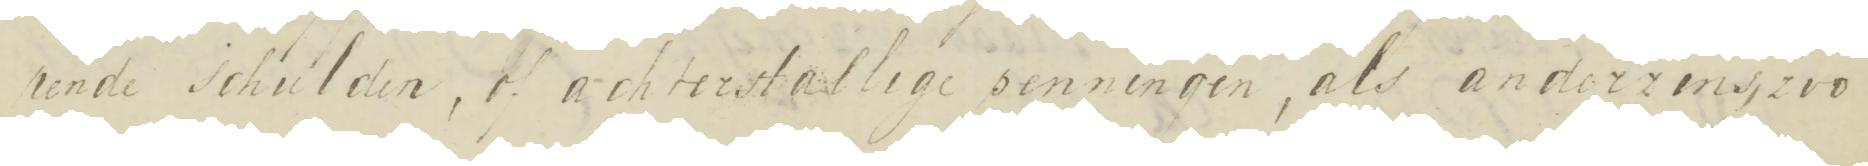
pende schulden, of achterstallige penningen, als anderzins, zoo
